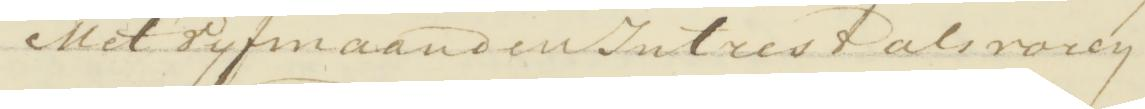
Met Vyf maanden Intrest als voren
